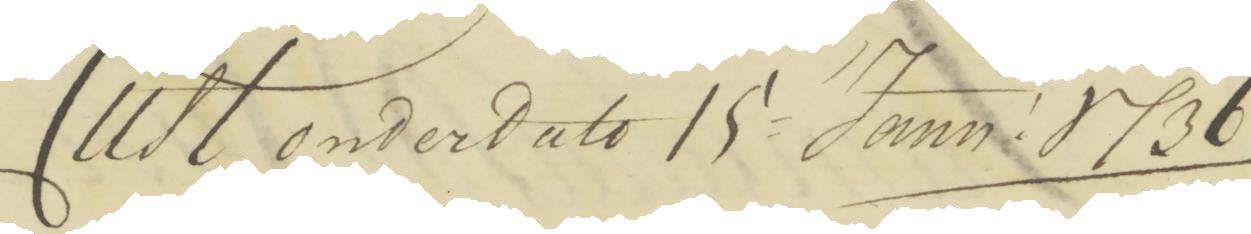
W:t Cust onder dato 15: Jann: 1736
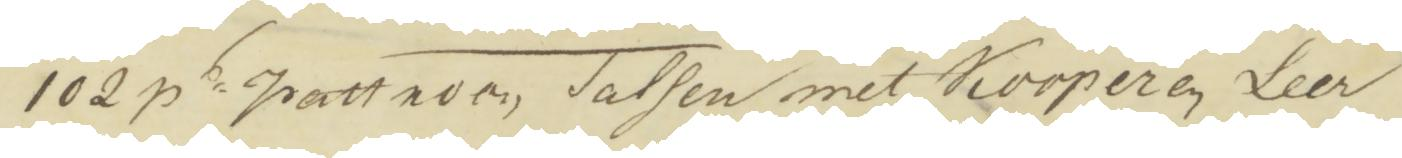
102 p:s pattroon Tassen met Kooper en leer
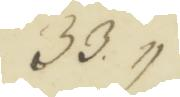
33„ _:o
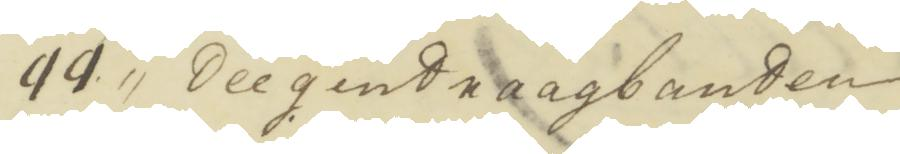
44.„ deegendraagbanden
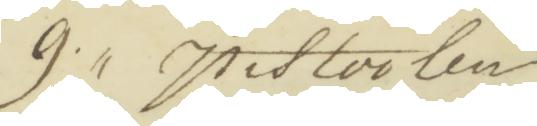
9.„ pistoolen
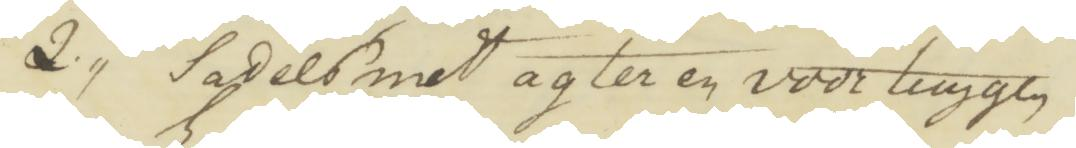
2.„ sadels met agter en voor tuijgen
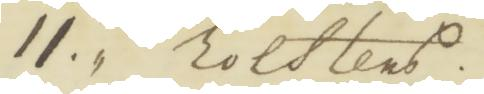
11.„ holsters
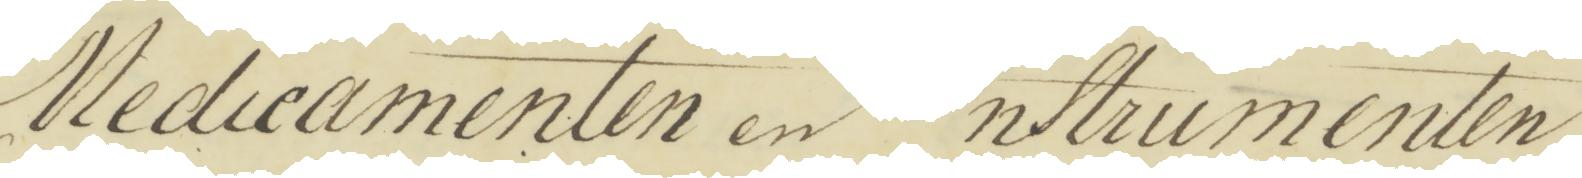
Medicamenten en Instrumenten
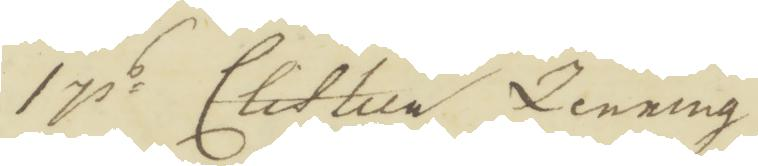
1 p:s Clistier Zenning
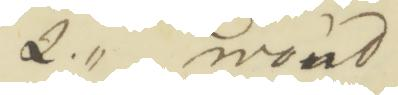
2.„ wond _:o
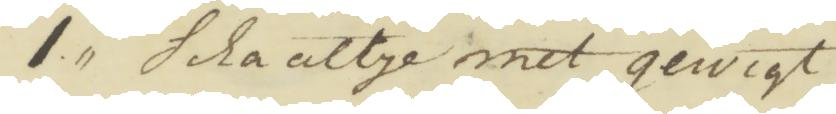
1.„ schaaltje met gewigt
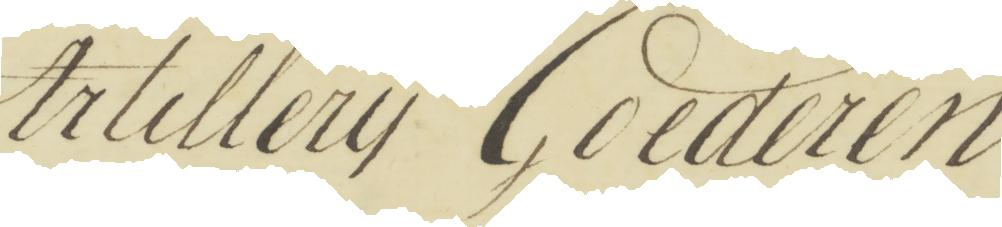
Artillerij Goederen
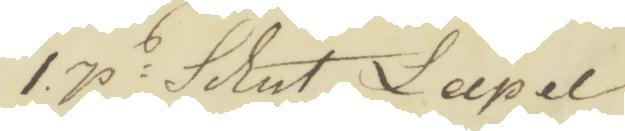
1. p:s schut leepel
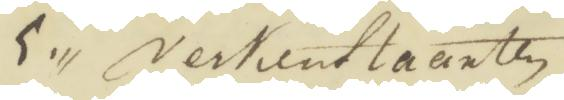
5.„ verkenstaarten
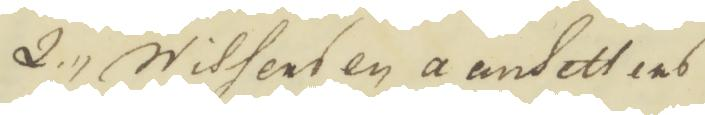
2.„ wissers en aansetters
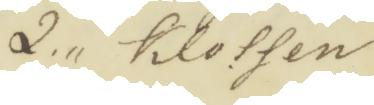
2.„ klossen
